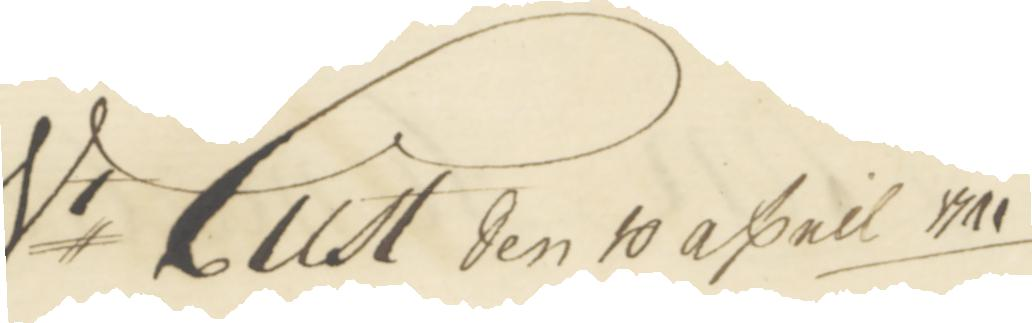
W#t Cust den 10 april 1711
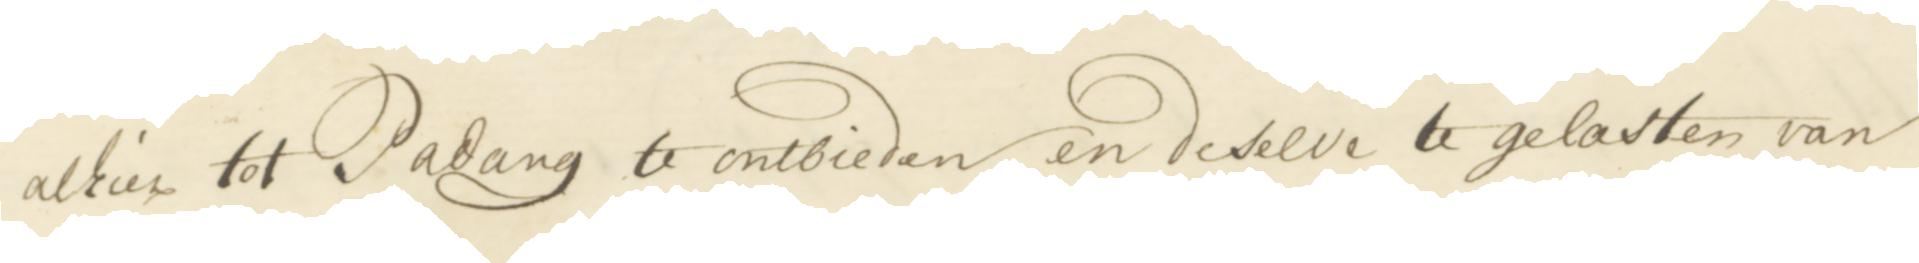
alhier tot Padang te ontbieden en deselve te gelasten van
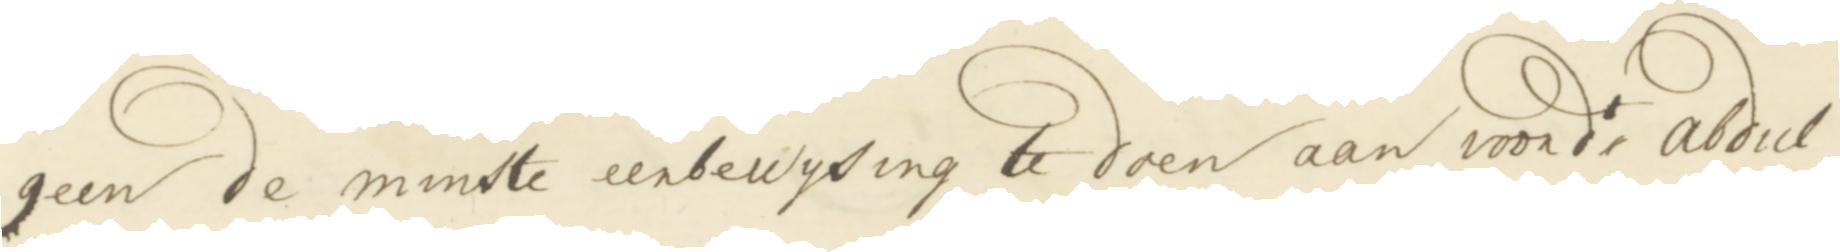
geen de minste eerbewysing te doen aan voord„t abdul
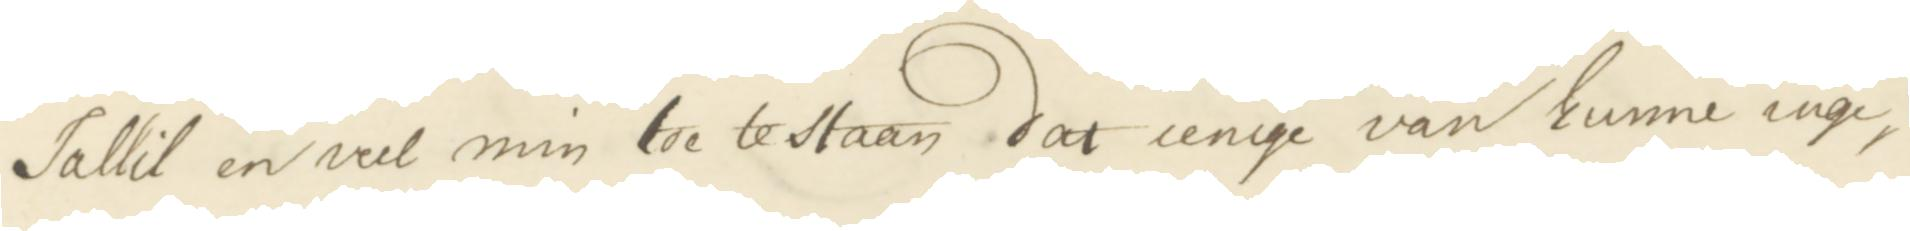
sallil en veel min toe te staan dat eenige van hunne inge„
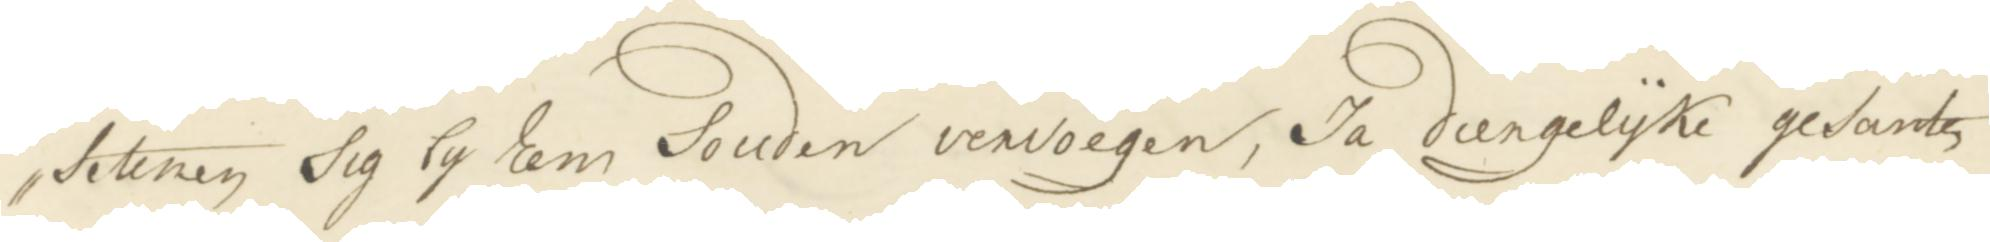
„setenen sig bij hem souden vervoegen, Ia diergelijke gesanten
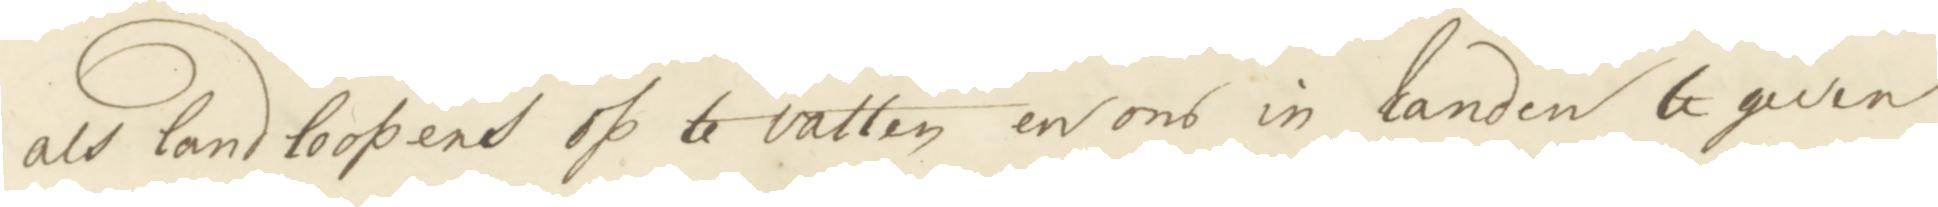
als landloopers op te vatten en ons in handen te geven
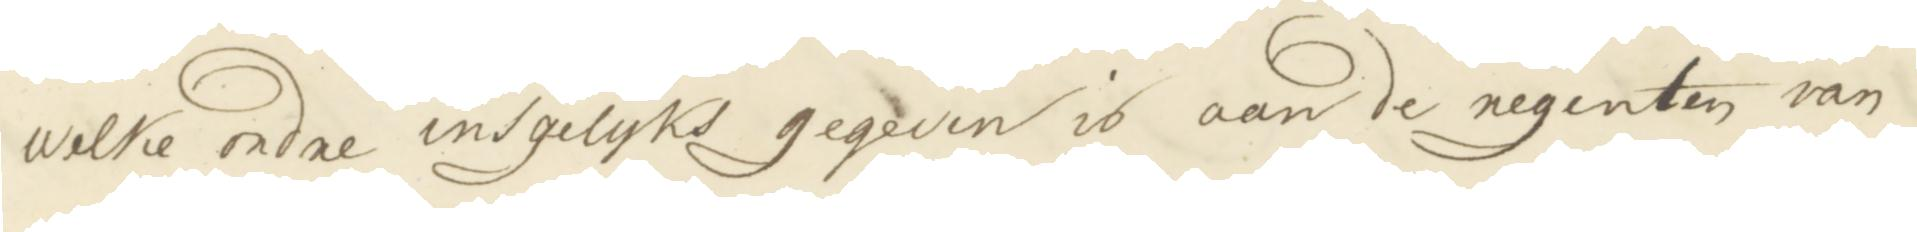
welke ordre insgelyks gegeven is aan de regenten van
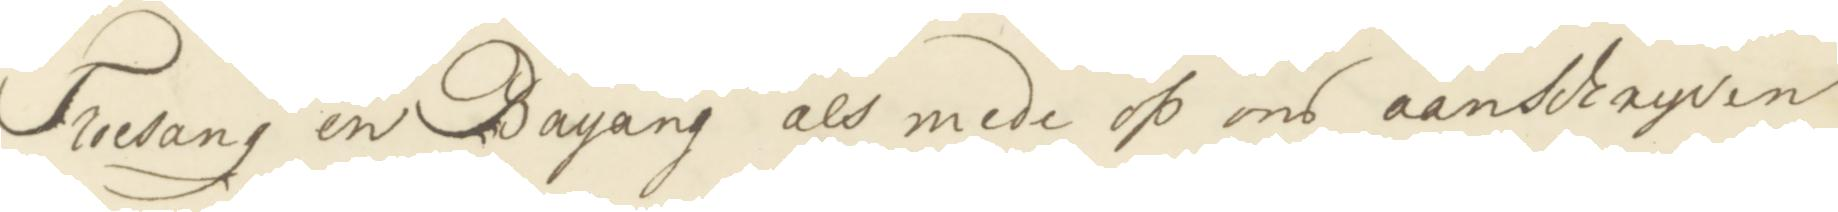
Troesan en Baijang als mede op ons aanschryven
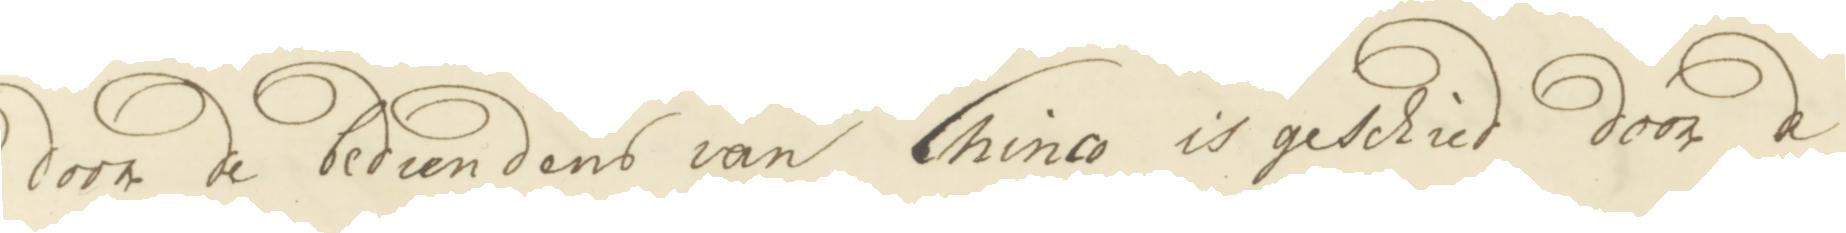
door de bediendens van China is geschied door de
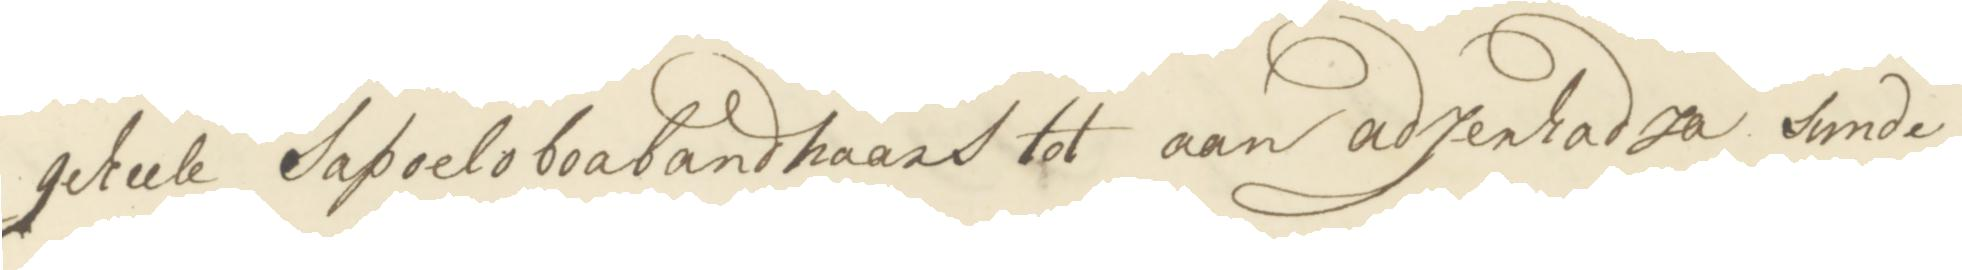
geheele sapoelo boabandhaars tot aan adjerhadIa sinde
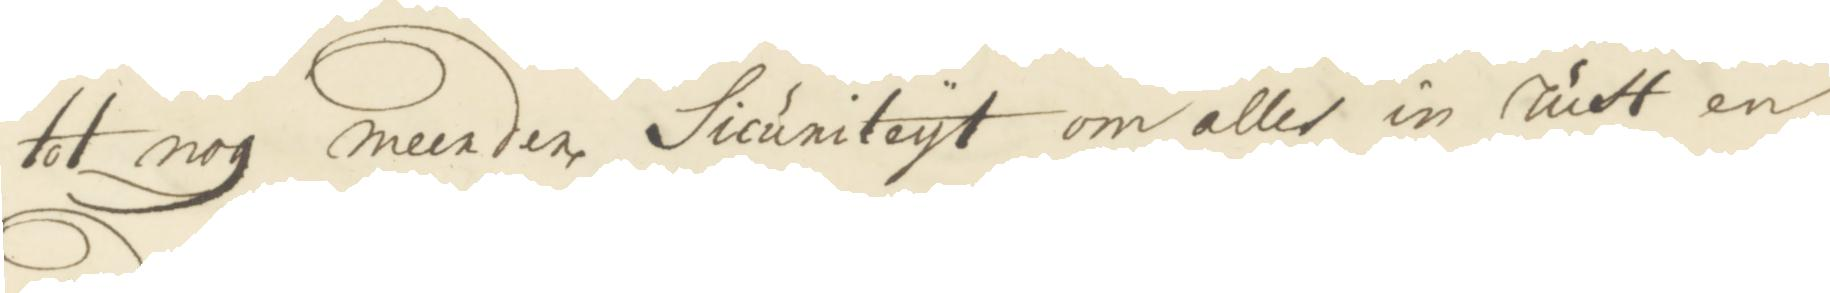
tot nog meerder sicuriteijt om alles in rust en
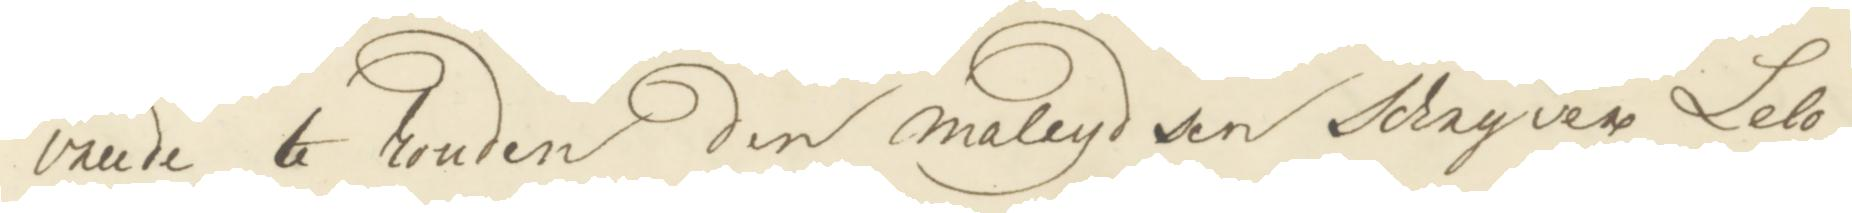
vreede t houden den maleijdsen schrijver Lelo
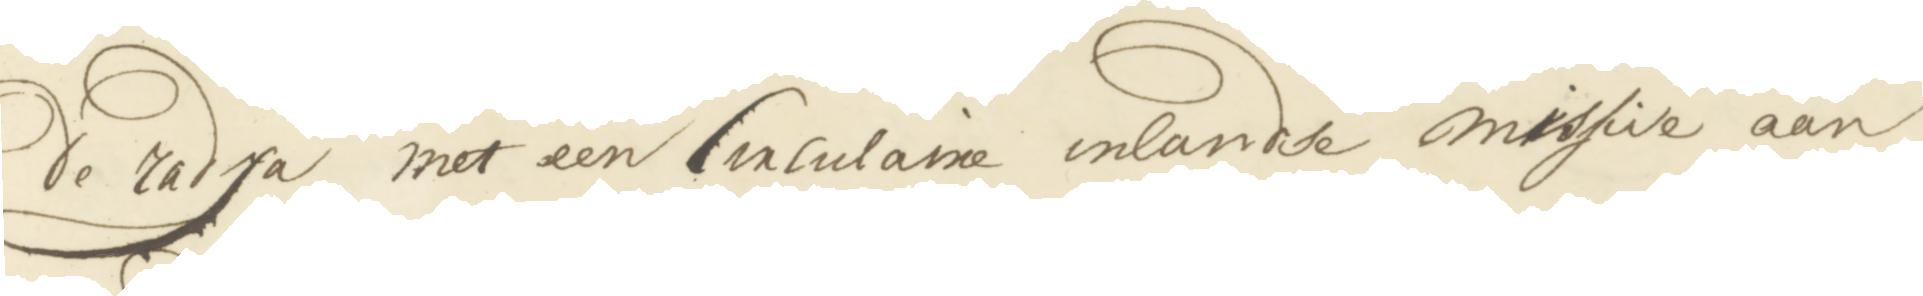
de radja met een Circulaire inlandse missie aan
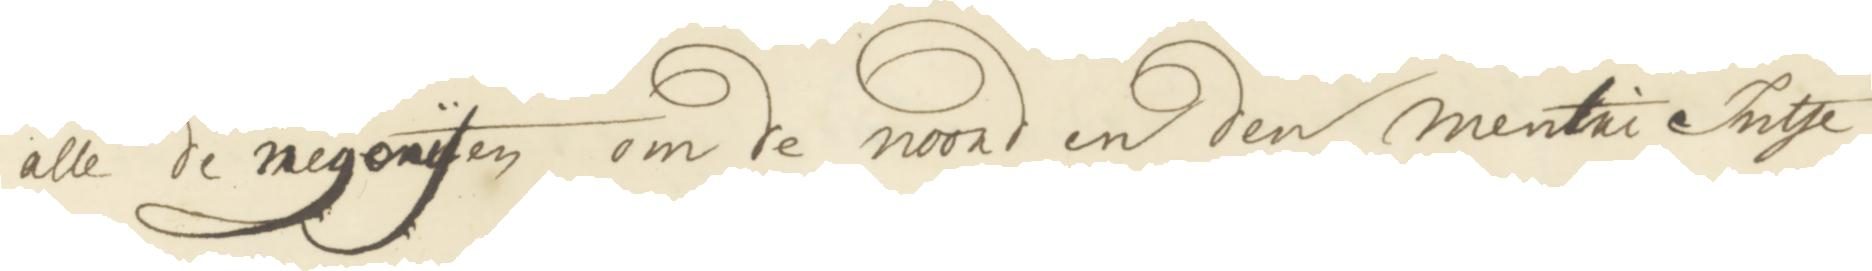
alle de negorijen om de noord en den mentri Intje
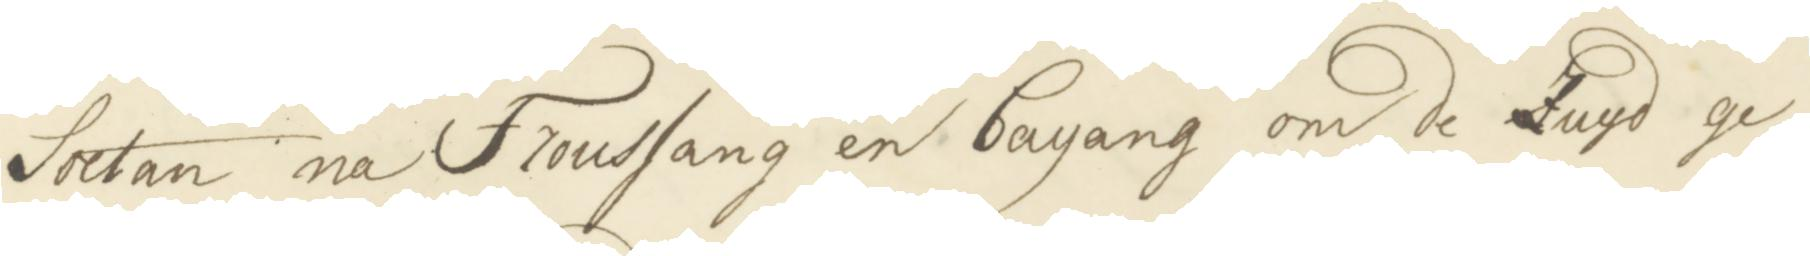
soltan na Troussang en bayang om de Zuijd ge
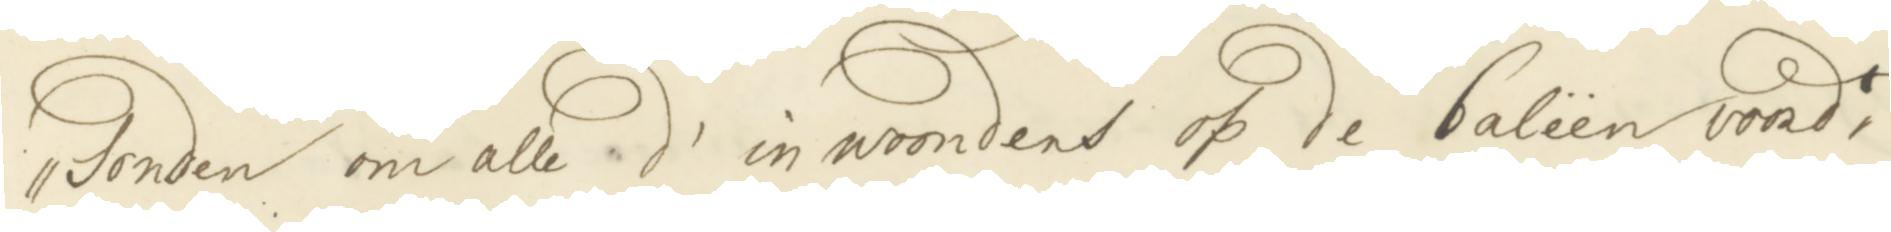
„sonden om alle d’ in woonders op de baleën voord„t
